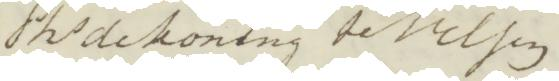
Phs de koning te Velsen
